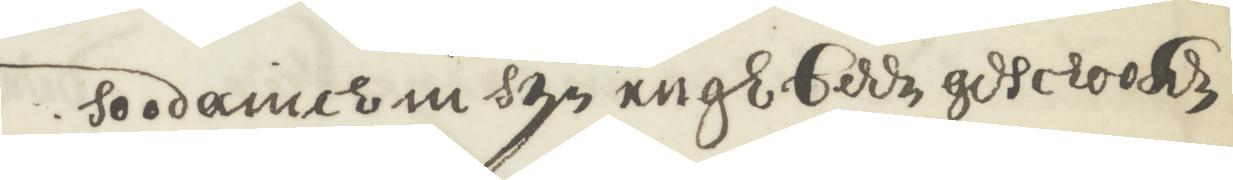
soodanich in sijn rugh been geschooten
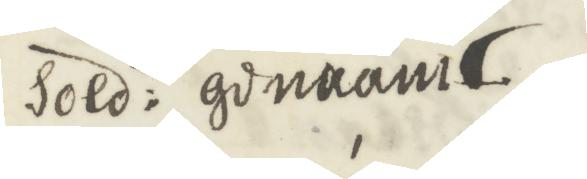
sold:t genaamt
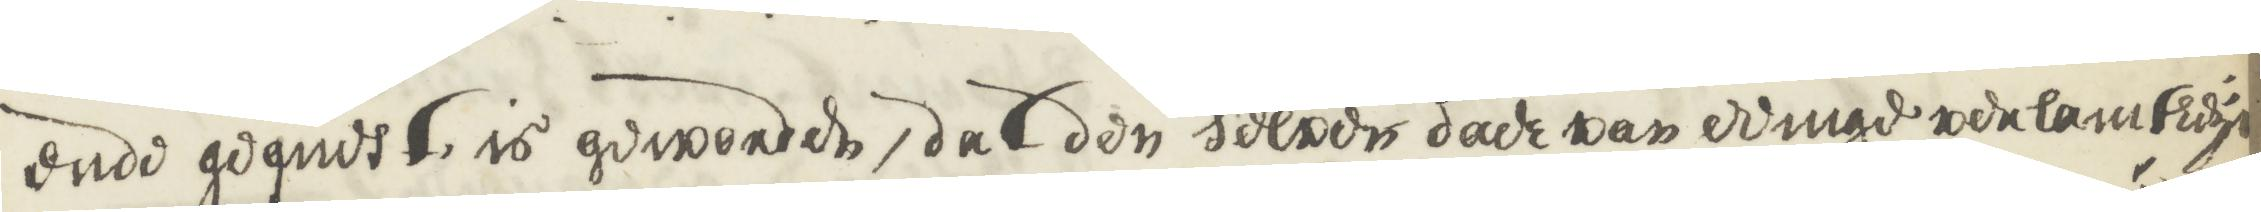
ende gequest is geworden, dat den selven daer van eenige verlamtheijt
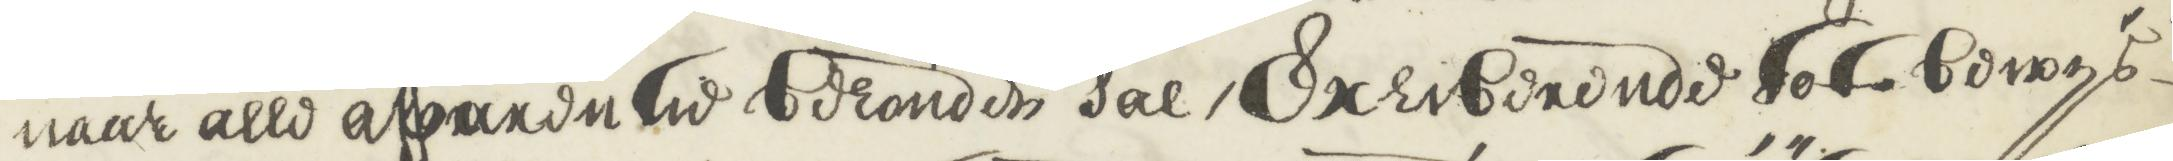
naar alle apparentie behouden sal, Exhiberende tot bewijs —
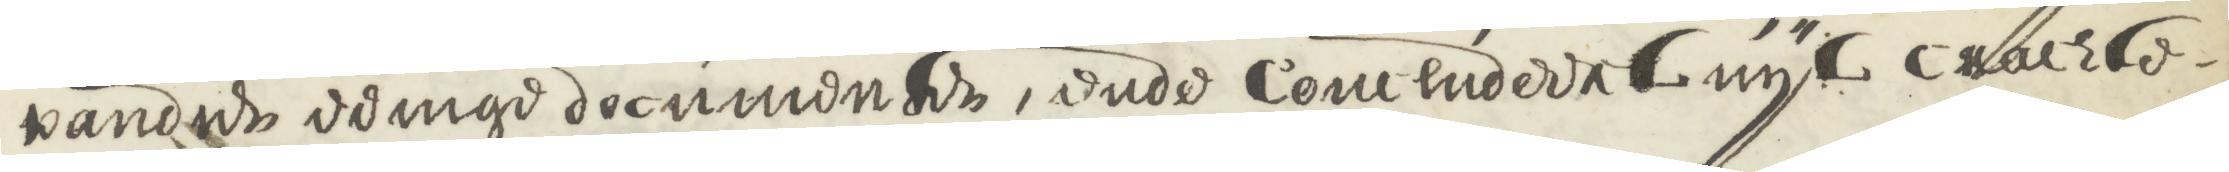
vandien eenige documenten, ende concludeert uijt crachte —
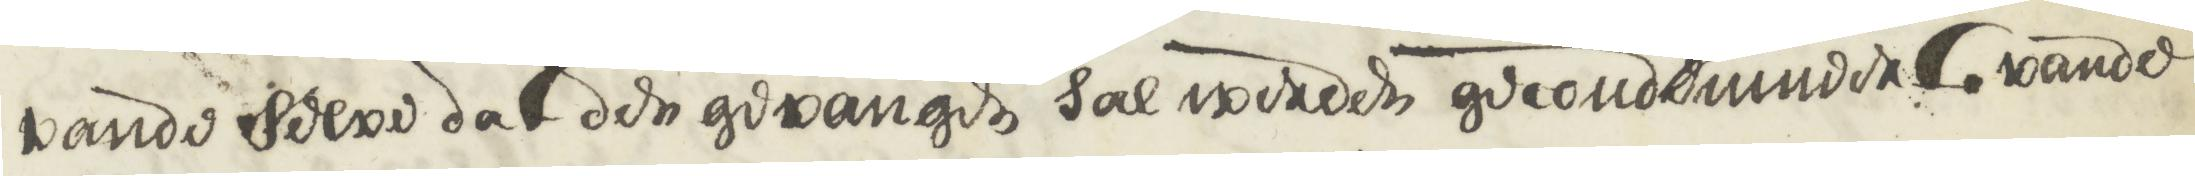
vande selve dat den gevangen sal werden gecondemneert vande
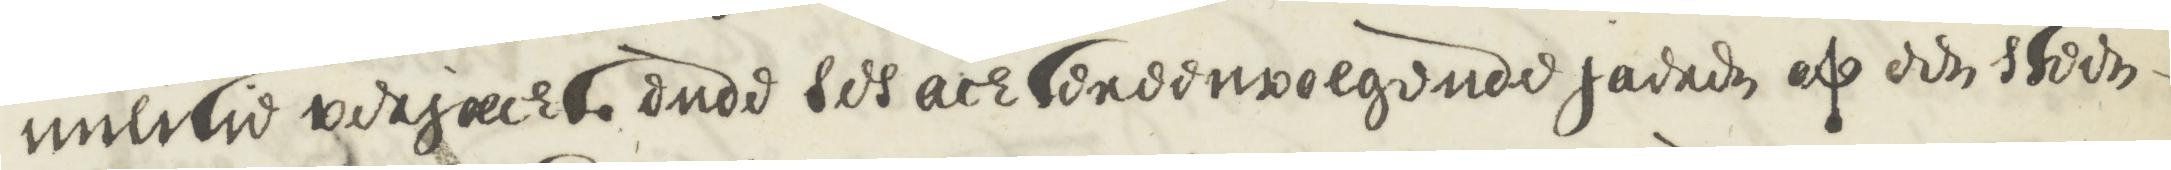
militie verjaecht ende ses achtereenvolgende jaeren op een steen —
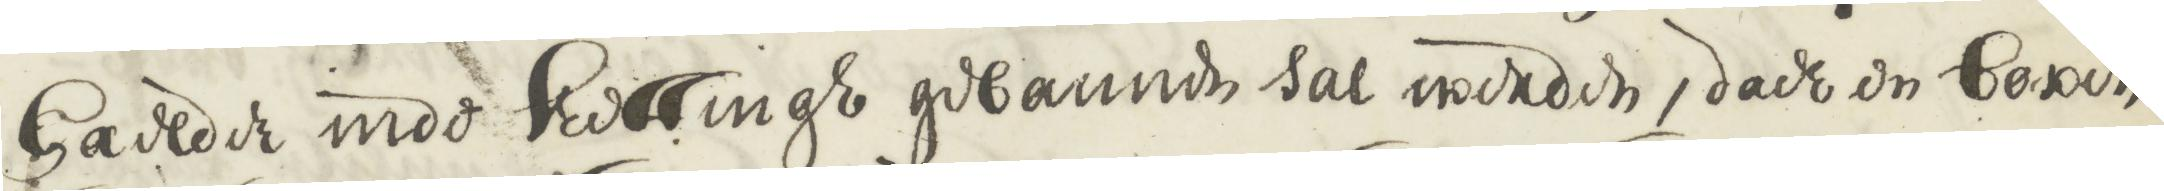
haelder inde kettingh gebannen sal werden, daer en boven
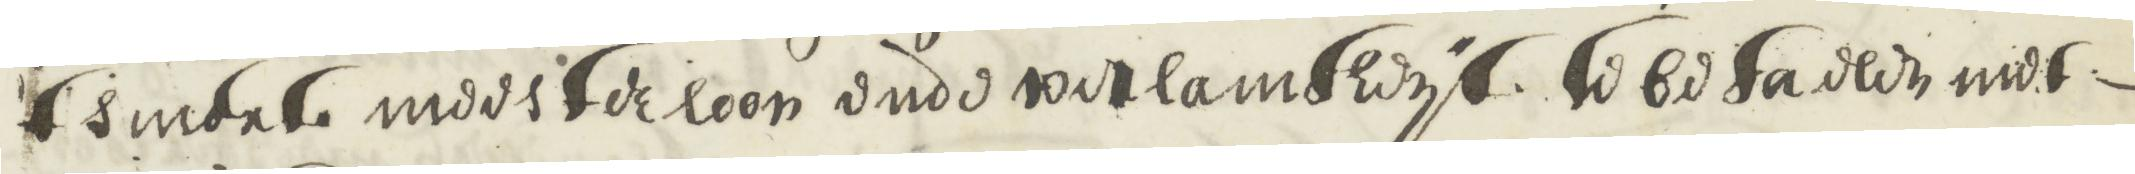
t smert meester loon ende verlamtheijt te betaelen met
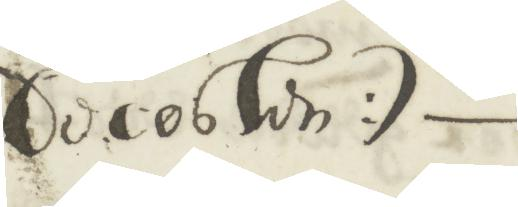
de costen :) —
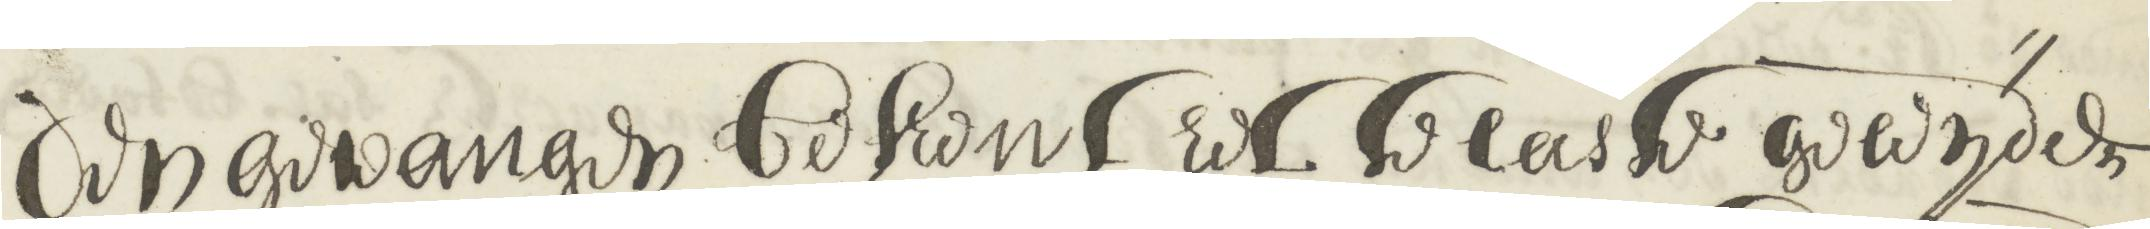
Den gevangen bekent het te laste geleijden
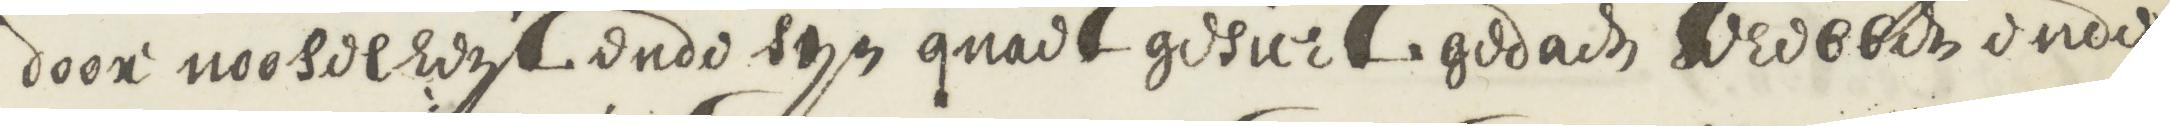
door nooselheijt ende sijn quaet gesicht gedaen tehebben ende
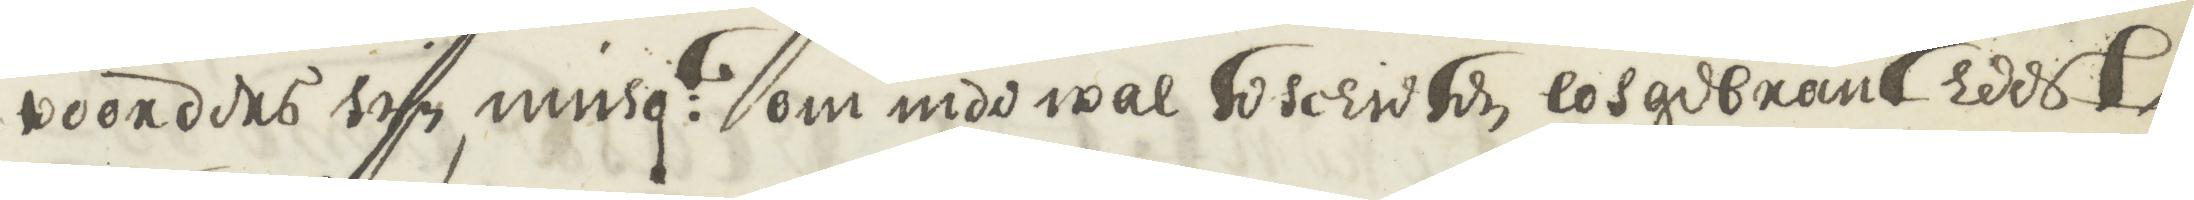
voorders sijn musq:t om inde wal te schieten losgebrant heeft,
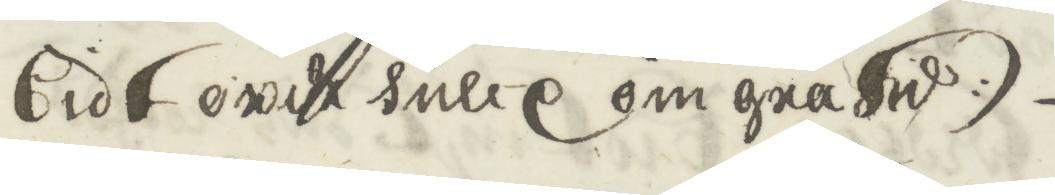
bidt over sulcx oim gratie :) —
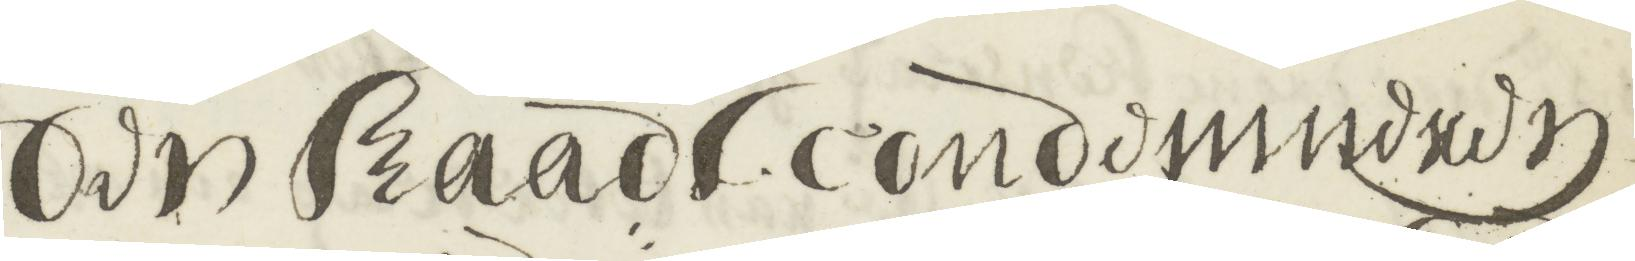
Den Raadt condemneren
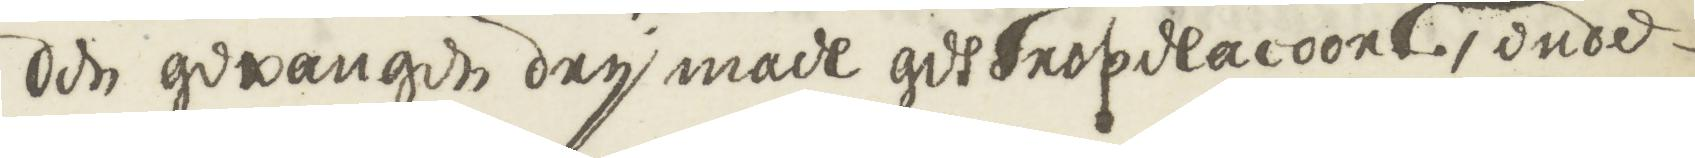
den gevangen drij mael gestropelacoort, ende —
